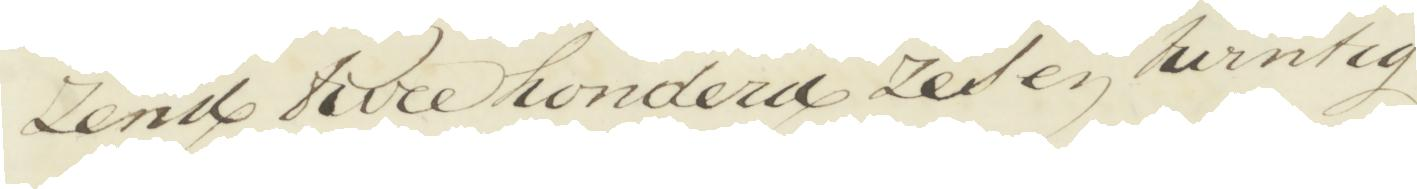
Zend twee honderd zes en twintig
